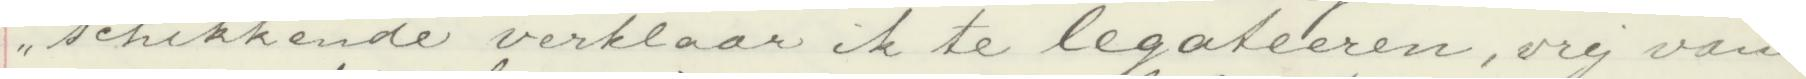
„ schikkende verklaar ik te legateeren, vrij van
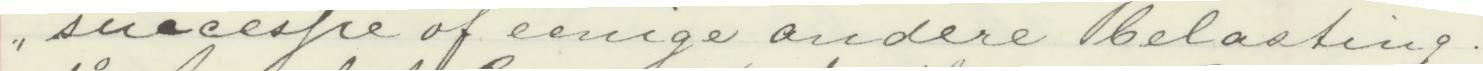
„ successie of eenige andere belasting
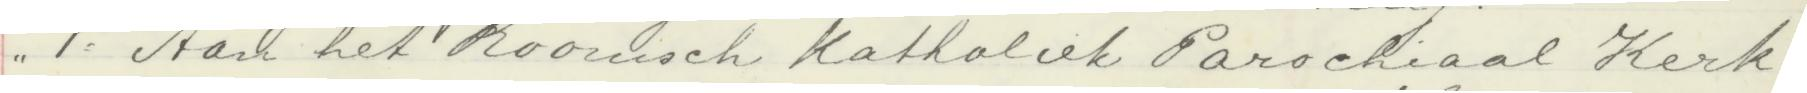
„ 1=o Aan het Roomsch Katholiek Parochiaal Kerk-
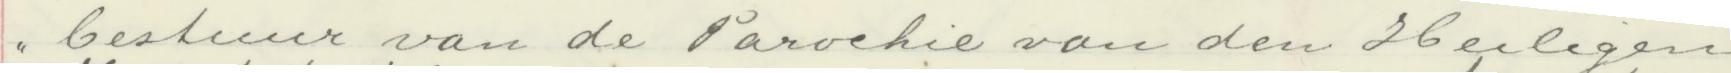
„ bestuur van de Parochie van den Heiligen
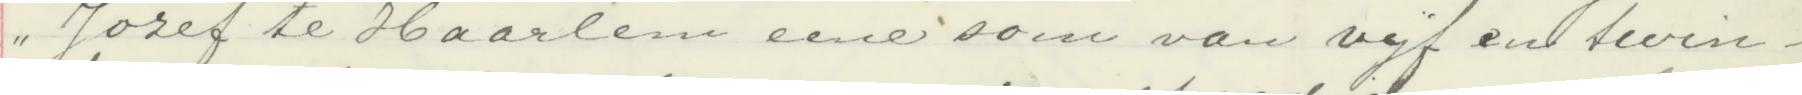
„ Jozef te Haarlem eene som van vijf en twin
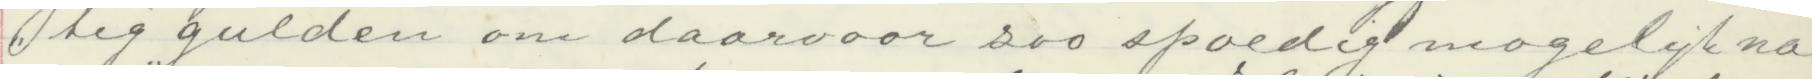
tig gulden om daarvoor zoo spoedig mogelijk na
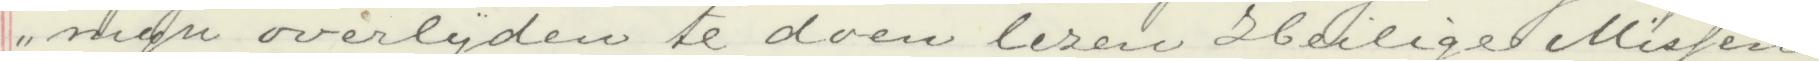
„ mijn overlijden te doen lezen Heilige Missen
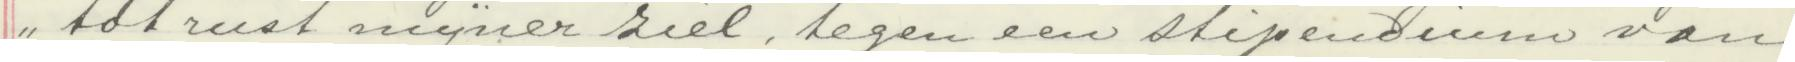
„ tot rust mijner ziel, tegen een stipendium van
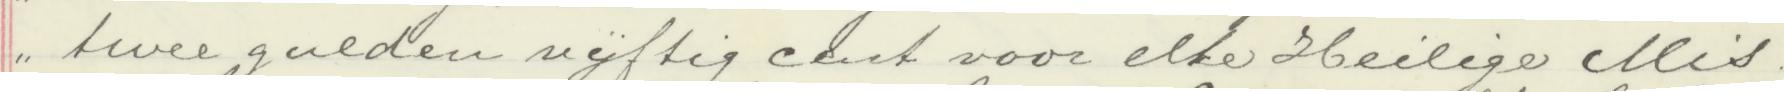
„ twee gulden vijftig cent voor elke Heilige Mis
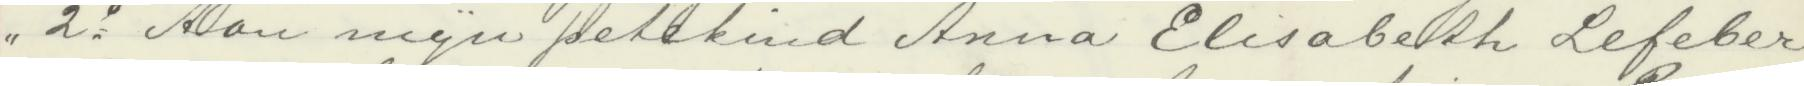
„ 2=o Aan mijn petekind Anna Elisabeth Lefeber
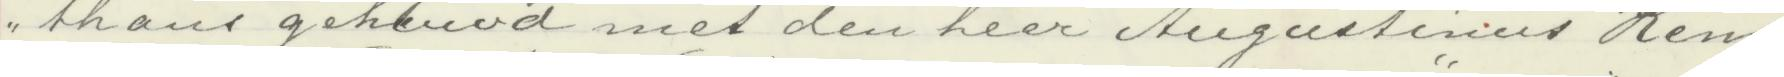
„ thans gehuwd met den heer Augustinus Rem
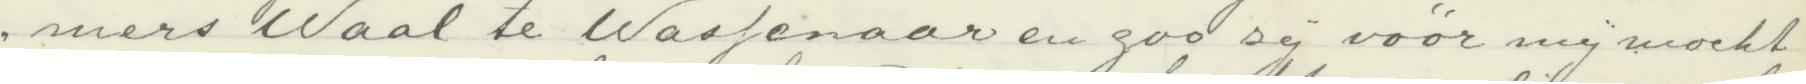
„ mers Waal te Wassenaar en zoo zij vóór mij mocht
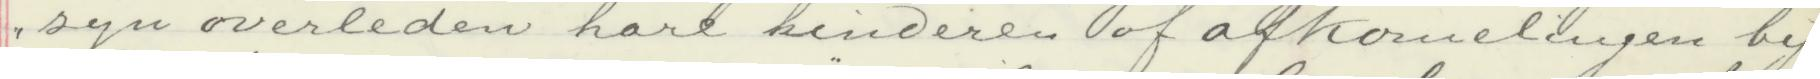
„ zijn overleden hare kinderen of afkomelingen by
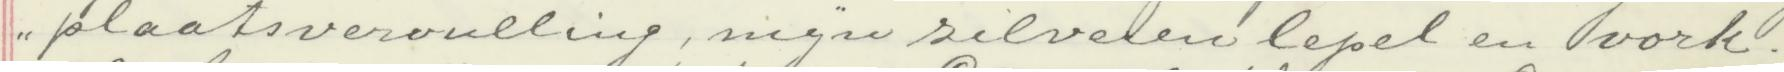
„ plaatsvervulling, mijn zilveren lepel en vork
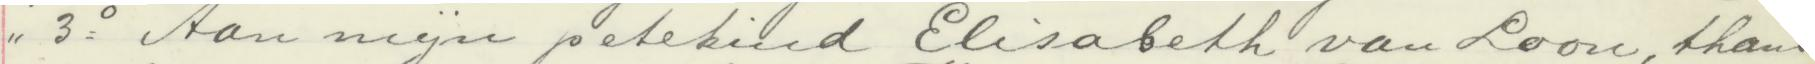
„ 3=o Aan mijn petekind Elizabeth van Loon, thans
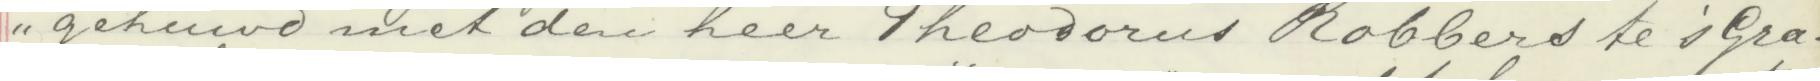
„ gehuwd met den heer Theodorus Robbers te 's Gra
